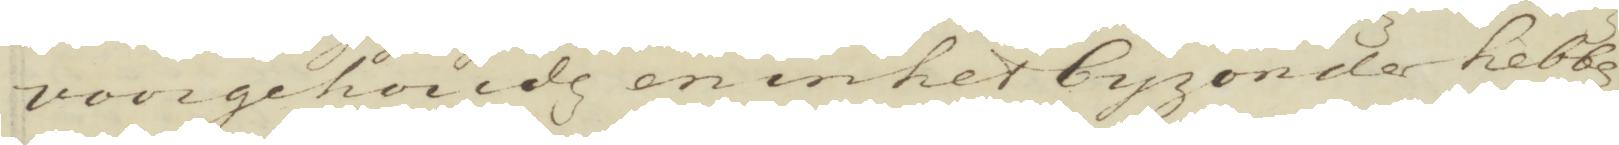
voorgehouden en in het byzonder hebben
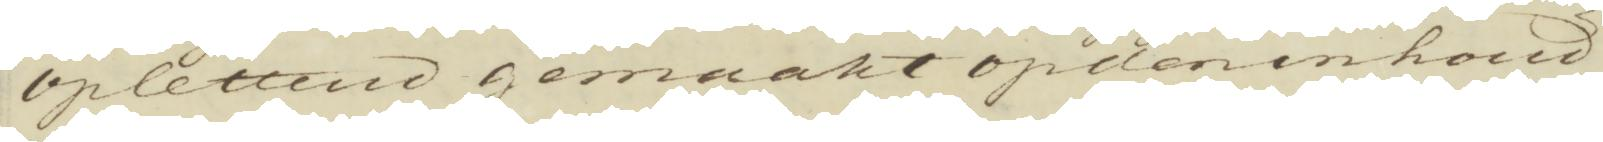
oplettend gemaakt op den inhoud
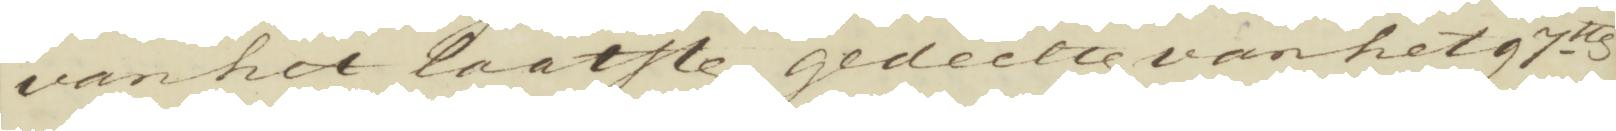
van het laatste gedeelte van het 97-st
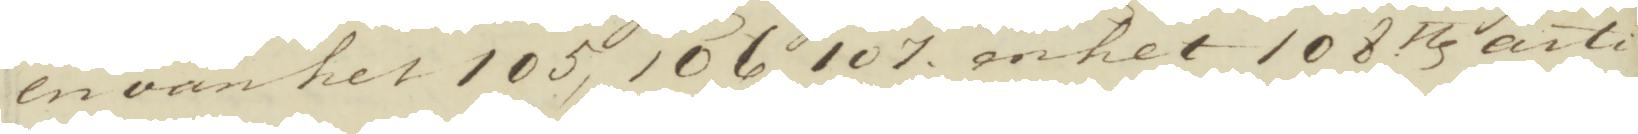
en van het 105, 106, 107. en het 108.ste arti
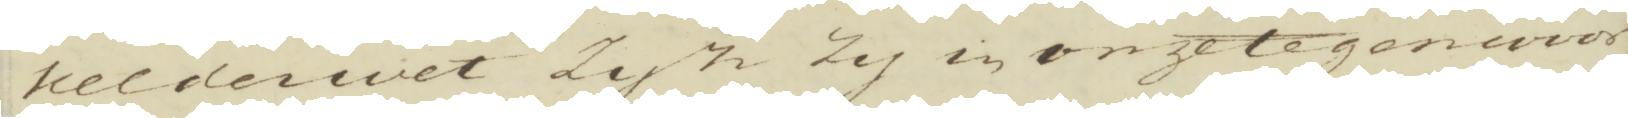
kel der wet zyn zy in onze tegenwoor
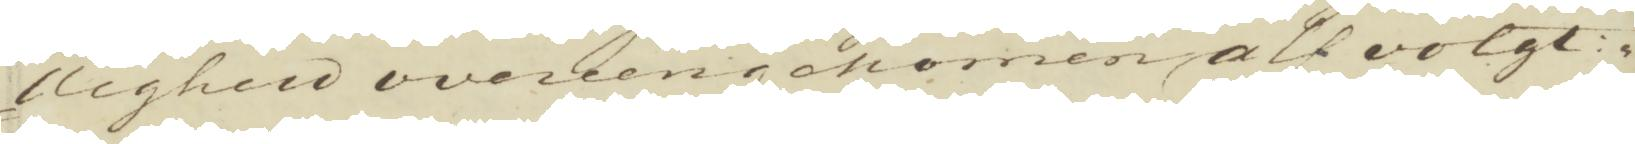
digheid overeengekomen, als volgt:
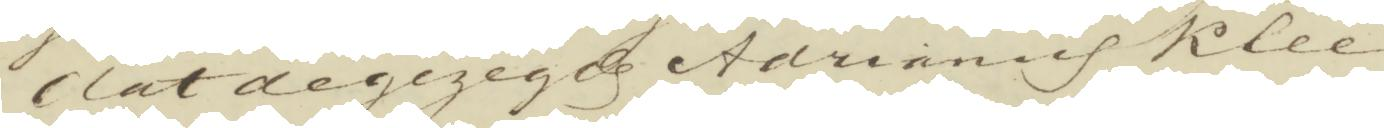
dat de gezegde Adrianus Klee
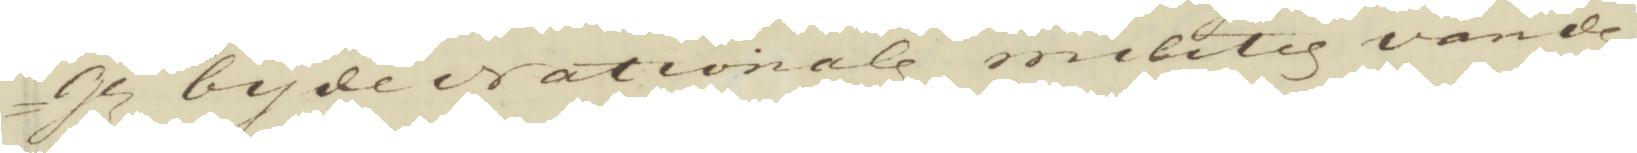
=gen by de Nationale militie van den
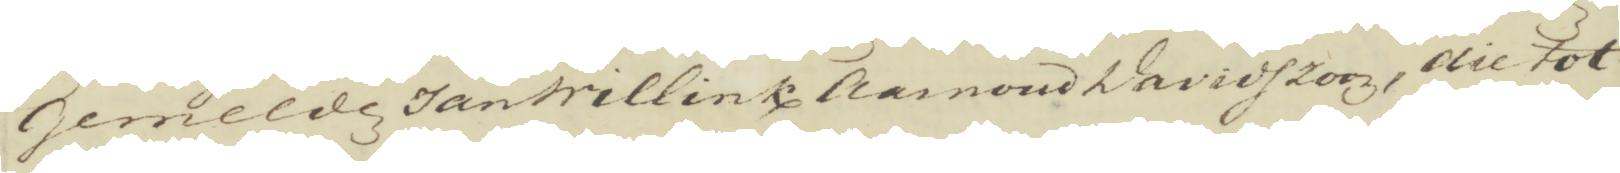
Gemelden Jan Willink Aannoud Davidszoon, die tot
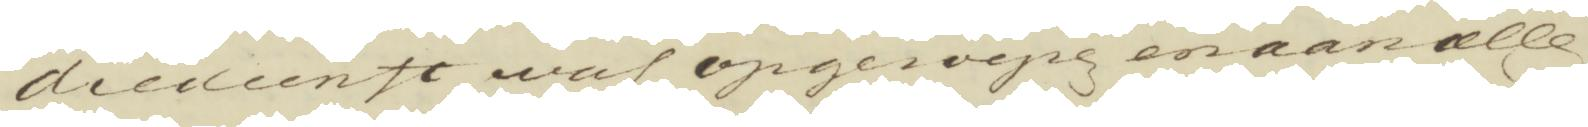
die dienst was opgeroepen en aan alle
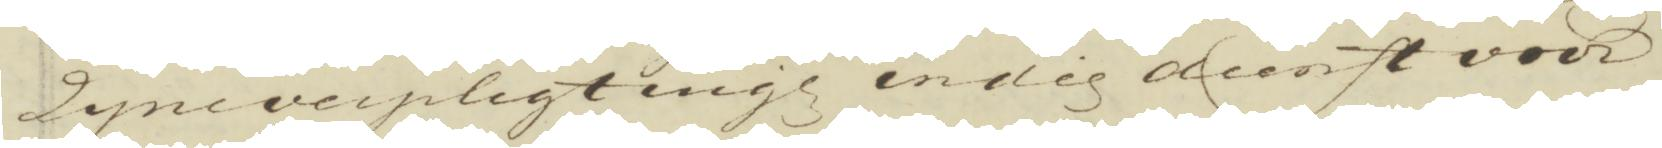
Zyne verpligtingen in die dienst voor
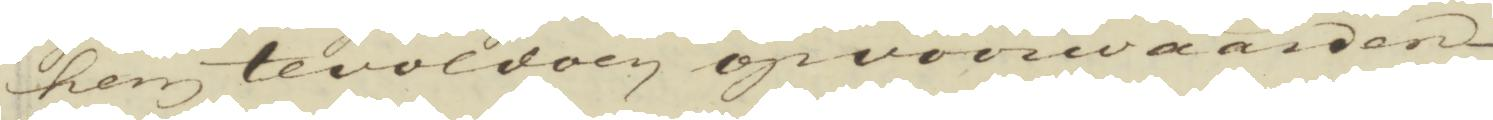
hem te voldoen op voorwaarden
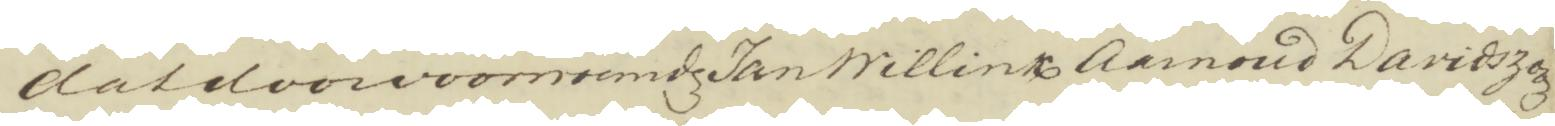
dat door voornoemden Jan Willink Aarnoud Davidszoon
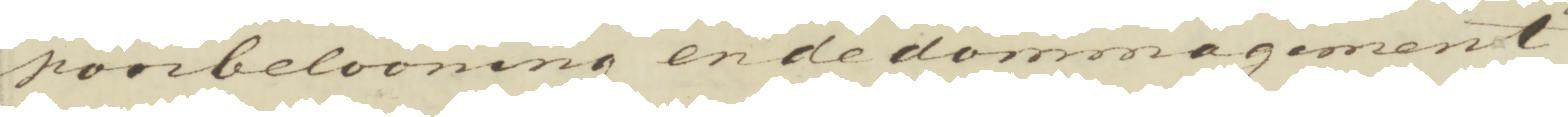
voorbelooning en de dommagement
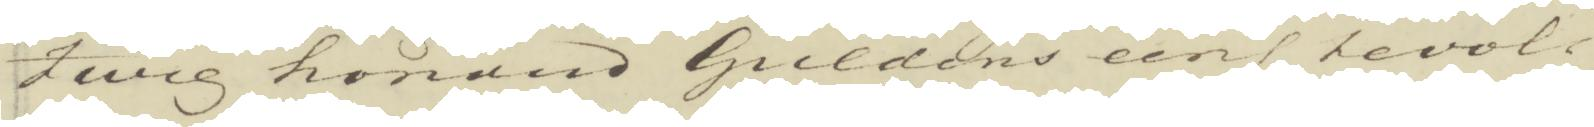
twee honderd Guldens eens tevol„
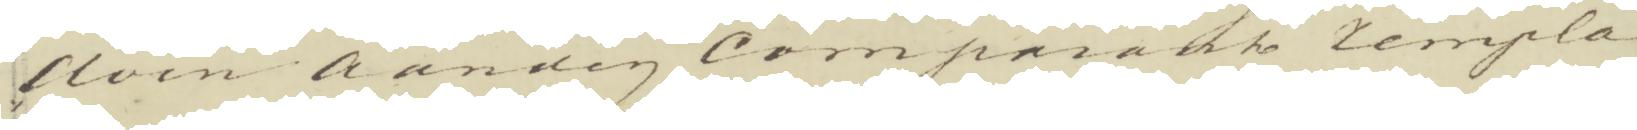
„doen aan den Comparant rempla
